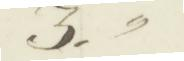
3. „
